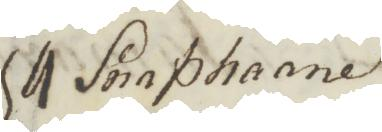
4 Snaphaane
